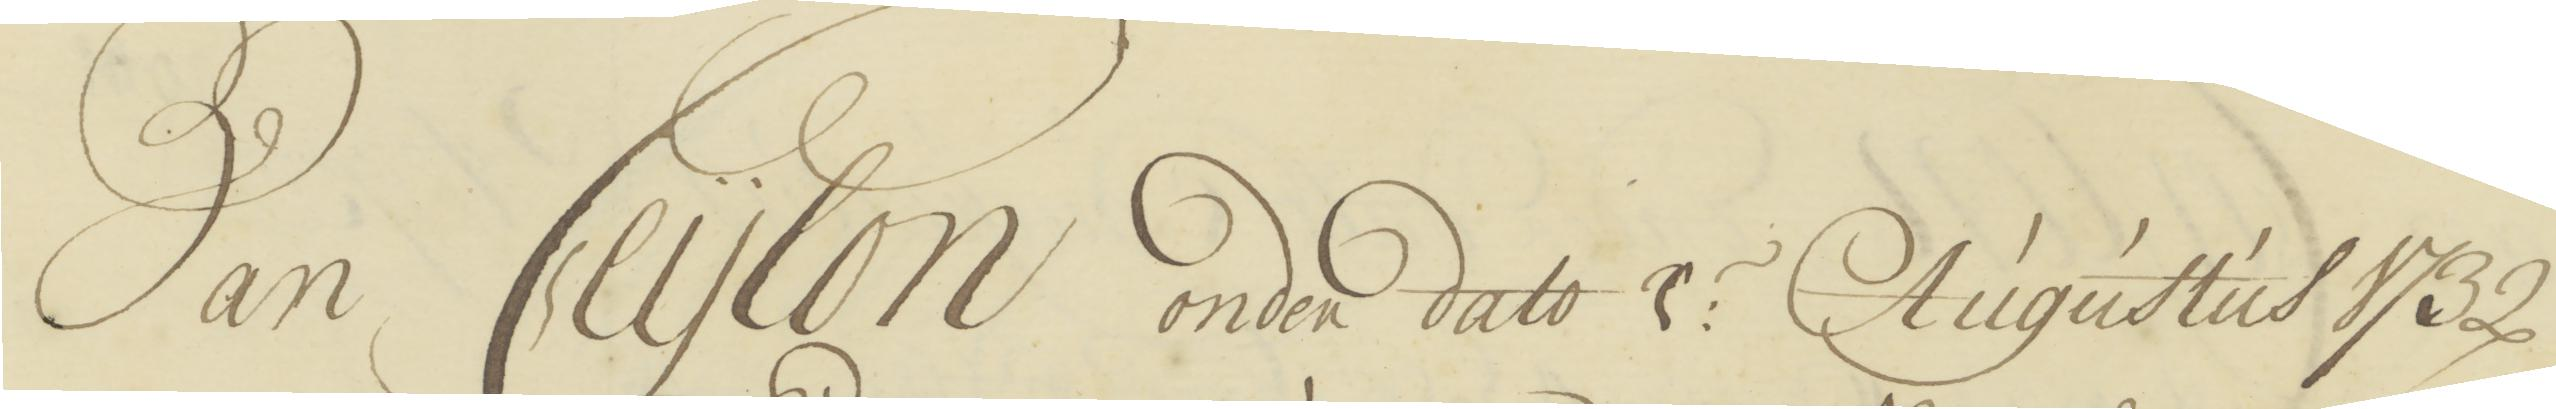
Van Ceijlon onder dato 5:e Augustus 1732
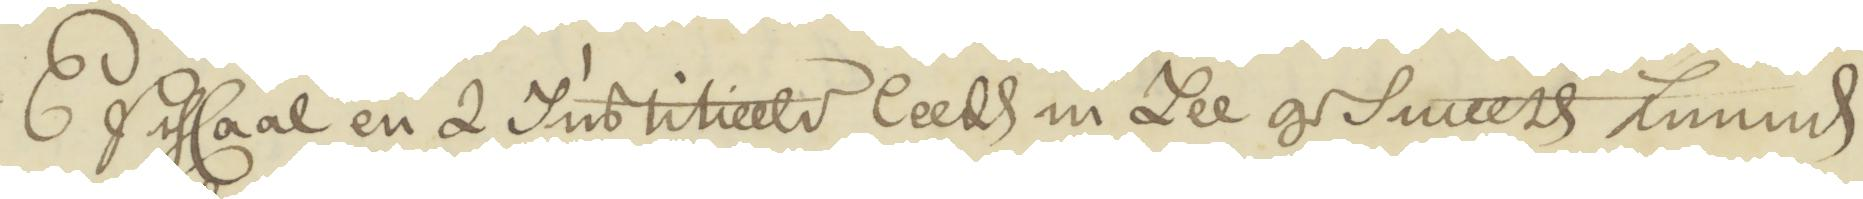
E fiscaal en 2 Iustitieele leeden in Zee gesmeeten kunnen
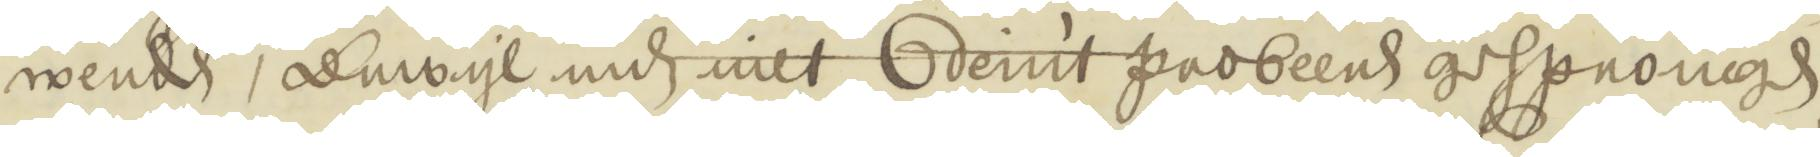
werden, terwijl men niet de in't probeeren gesprongen
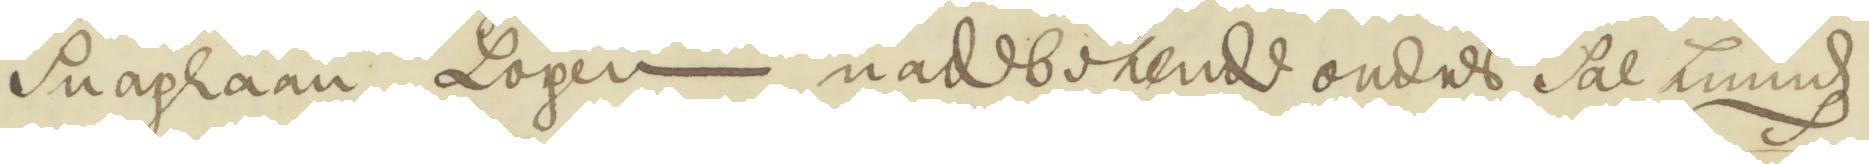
snaphaan Lopen na de bekende ordres Sal kunnen
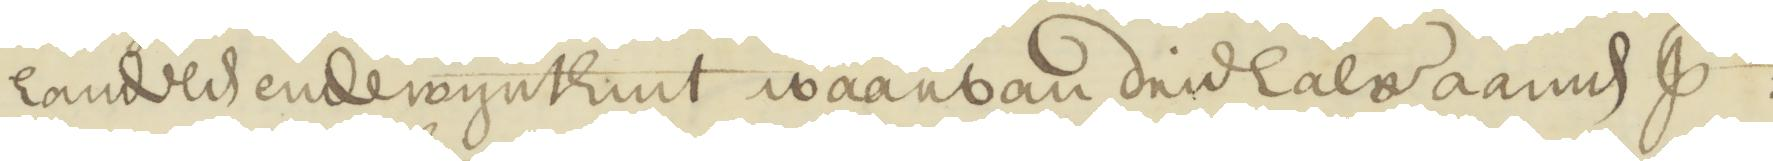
handelen ende wynthuit waarvan drie halve aamen p:s
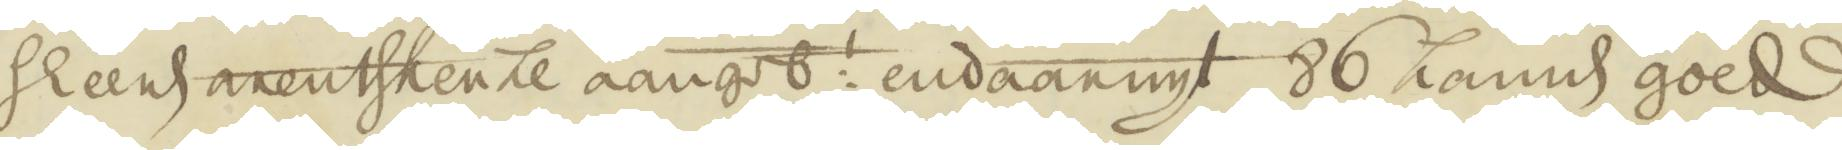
sheeren arentskerke aangeb:t en daaruyt 86 kannen goede
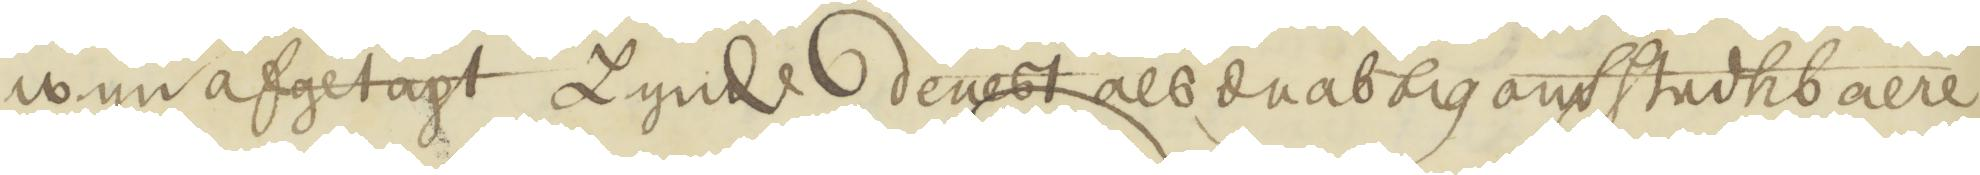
wyn afgetapt Zynde de rest als drabbig onverstrekbaere
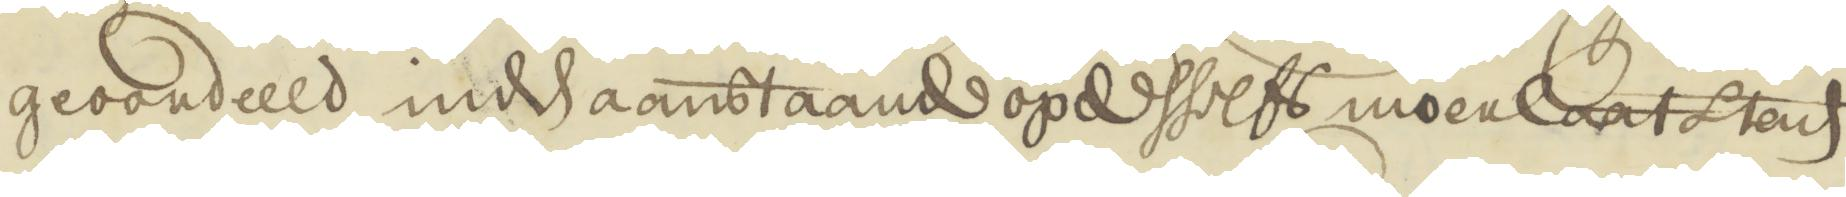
geoordeeld inden aanstaande op desselfs moer laatstenen
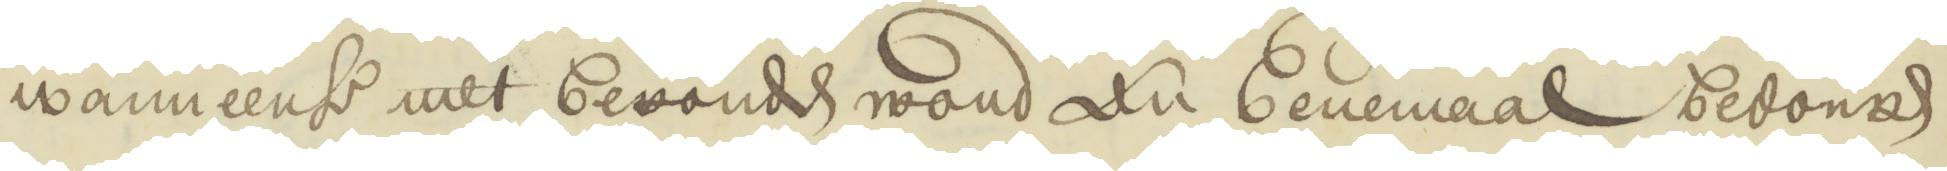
wanneerse niet bevonden word ten Eenemaal bedorven
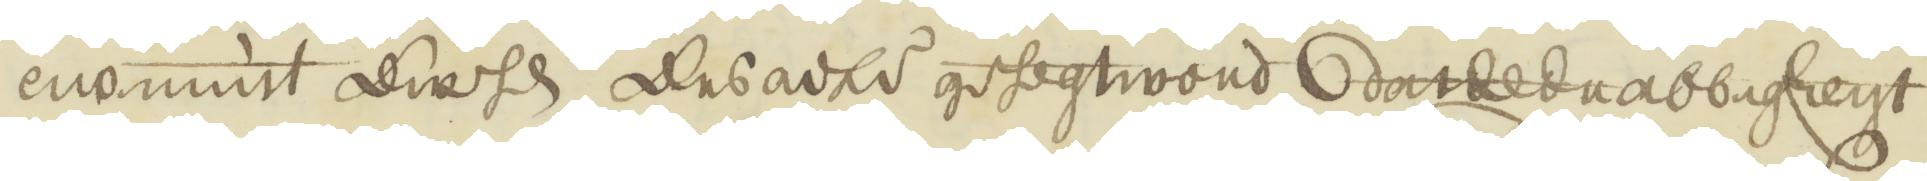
en onnut tewesen tersaeke gesegt word dat de drabbigheyt
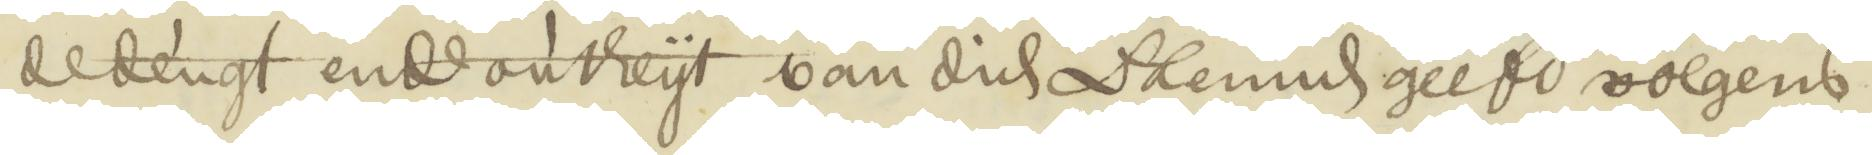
de deugt ende outheijt van dien tekennen geefd volgens
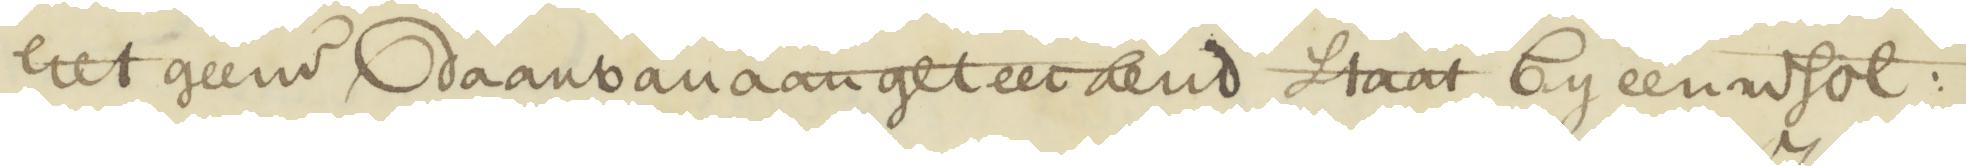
het geene daarvan aangeteeckend staat by een resol:
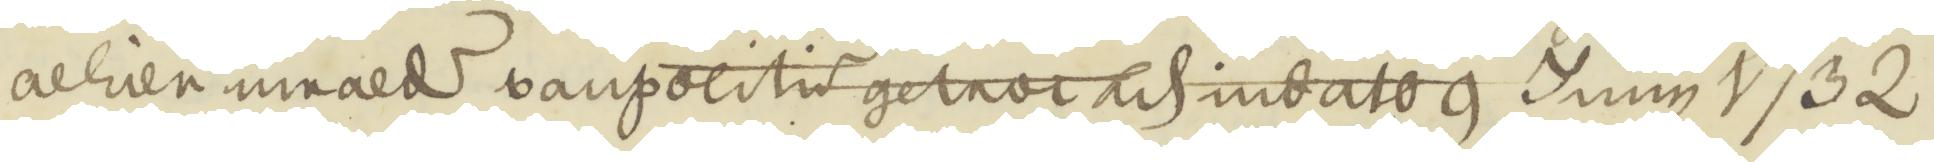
alhier inraede vanpolitie getrocken indato 9 Iuny 1732
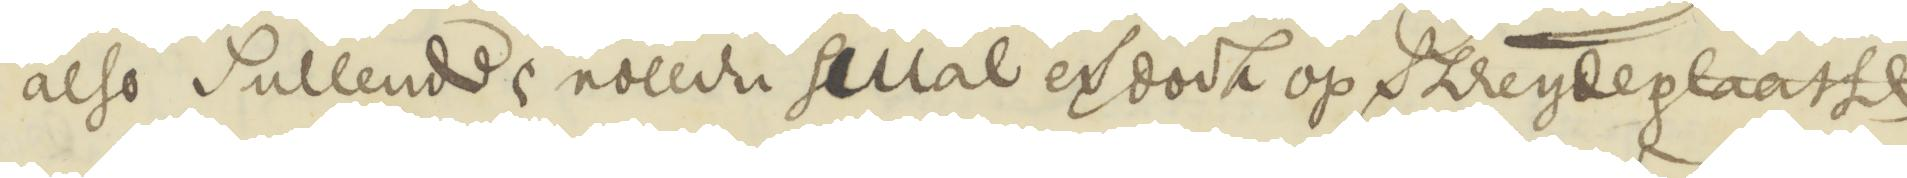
also Sullende 5 rollen smal everdoek op verscheyde plaatsen
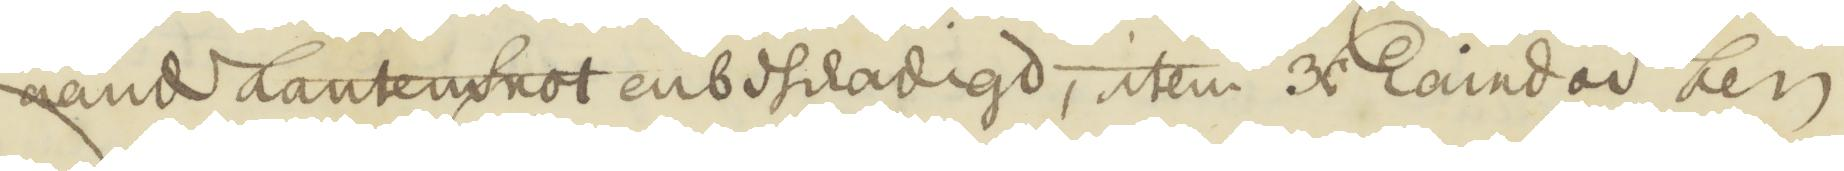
aande kanten verrot en beschadigd, item 35 hairdoeken
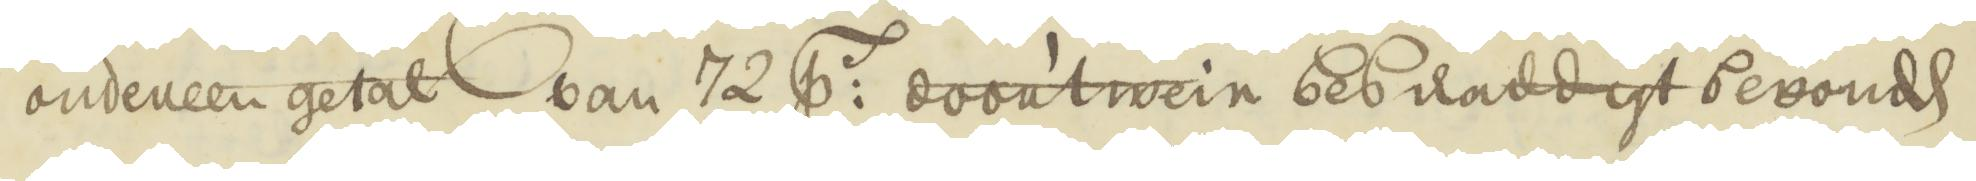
onder een getal van 72 p:s door 't weir beschaedigt bevonden
